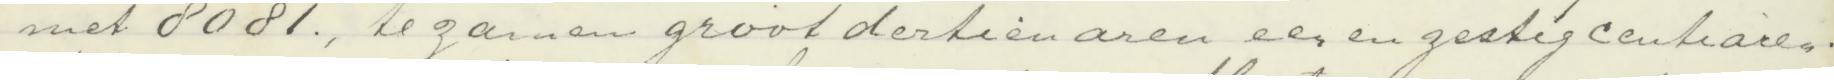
met 8081., te zamen groot dertien aren een en zestig centiaren
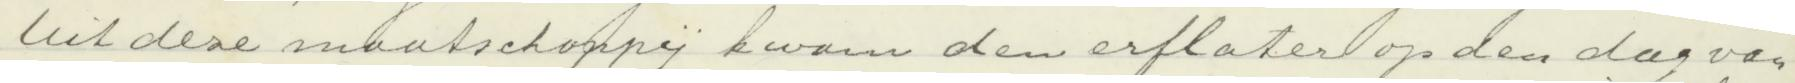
Uit deze maatschappij kwam den erflater op den dag van
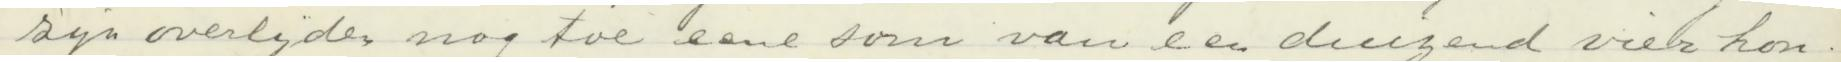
zijn overlijden nog toe eene som van een duizend vier hon
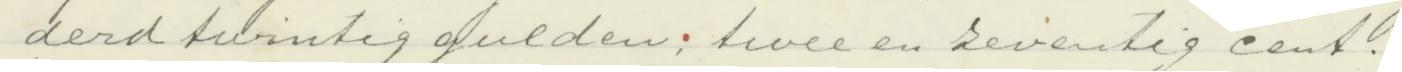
derd twintig gulden; twee en zeventig cent.
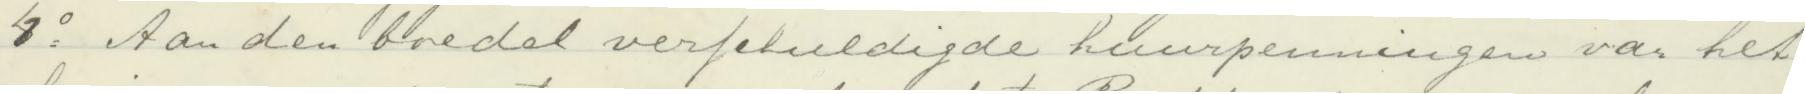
4:o Aan den boedel verschuldigde huurpenningen van het
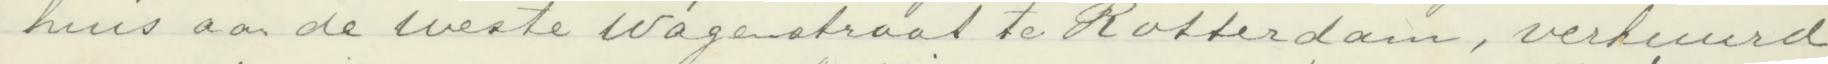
huis aan de weste wagenstraat te Rotterdam, verhuurd
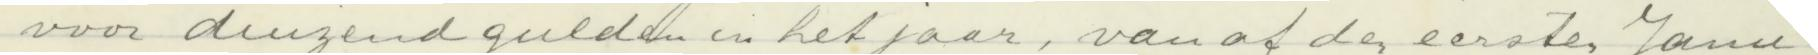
voor duizend gulden in het jaar, van af den eersten Janu
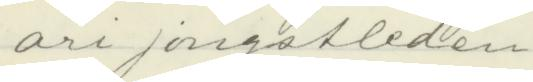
ari jongstleden
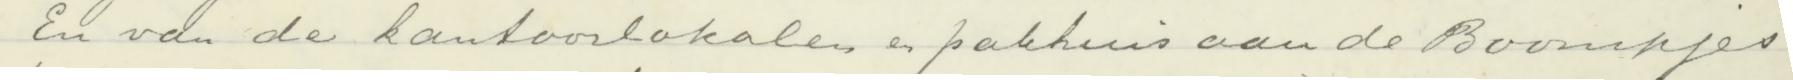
En van de kantoorlokalen en pakhius aan de Boompjes
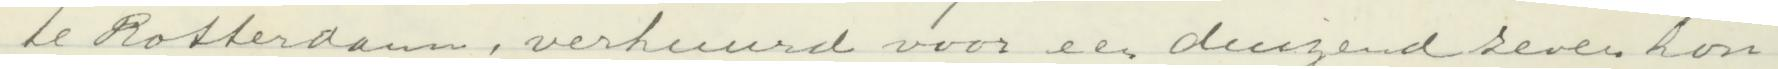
te Rotterdam, verhuurd voor een duizend zeven hon
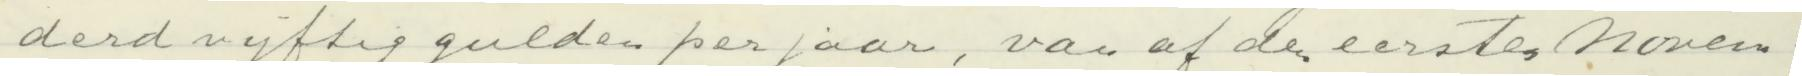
derd vijftig gulden per jaar, van af den eerste novem
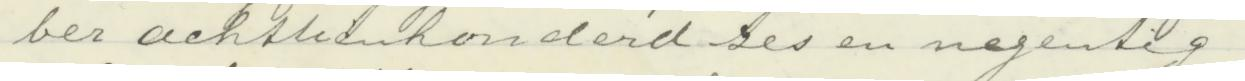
ber achttienhonderd zes en negentig
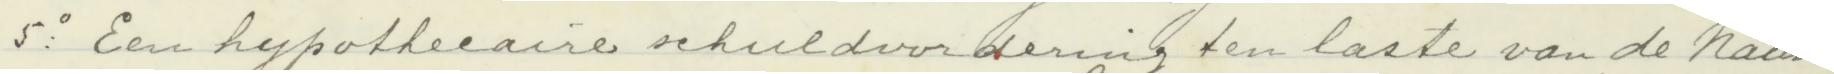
5:o Een hypothecaire schuldvordering ten laste van de Naam
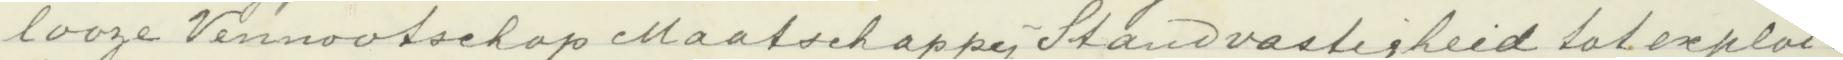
looze Vennootschap Maatschappij Standvastigheid tot exploi
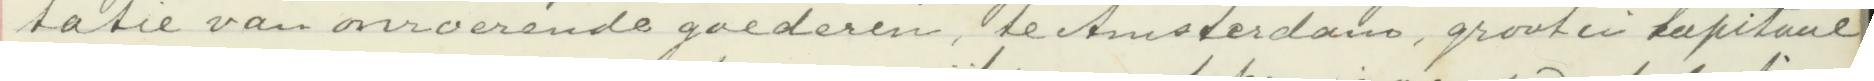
tatie van onroerende goederen, te Amsterdam, groot in kapitaal
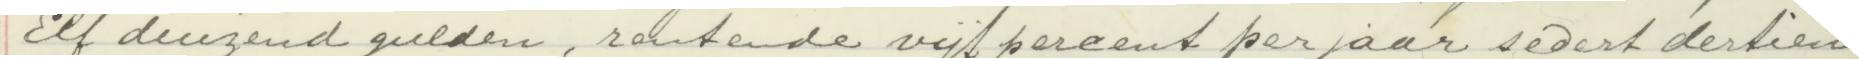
Elf duizend gulden, rentende vijf percent per jaar sedert dertien
